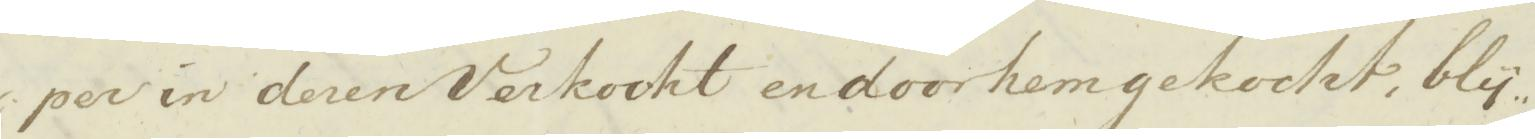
„per in dezen Verkocht en door hem gekocht, blij„
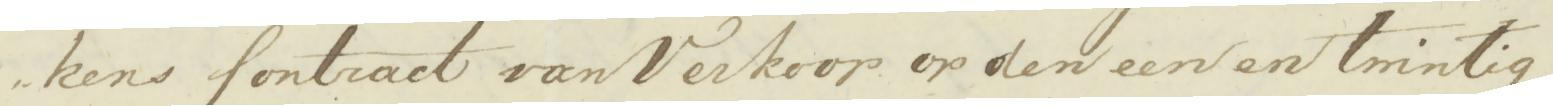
„kens Contract van Verkoop op den een en twintig
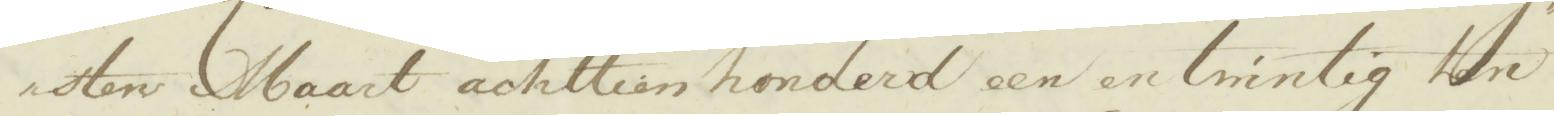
sten Maart achttien honderd een en twintig ten
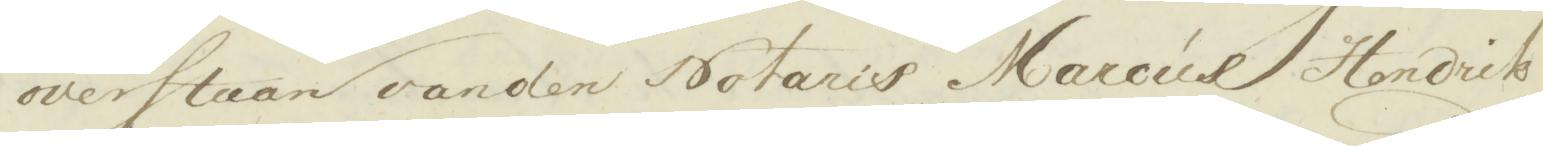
overstaan van den Notaris Marcus Hendrik
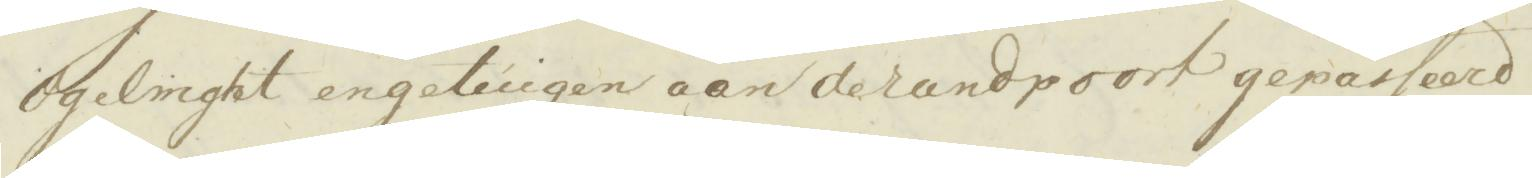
Ogelwight en getuigen aan de randpoort gepasseerd
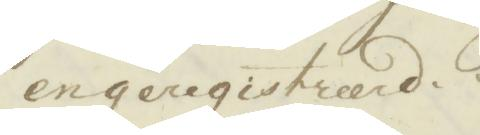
en geregistreerd.
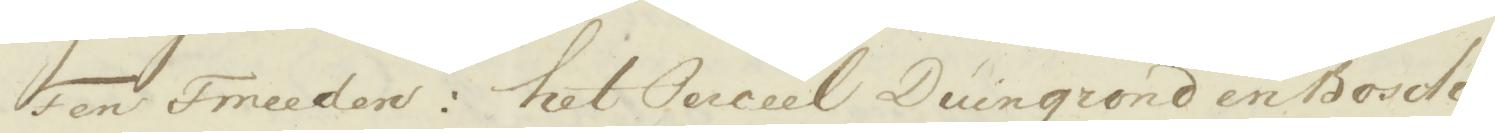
Ten Tweeden: het Perceel Duingrond en Bosche,
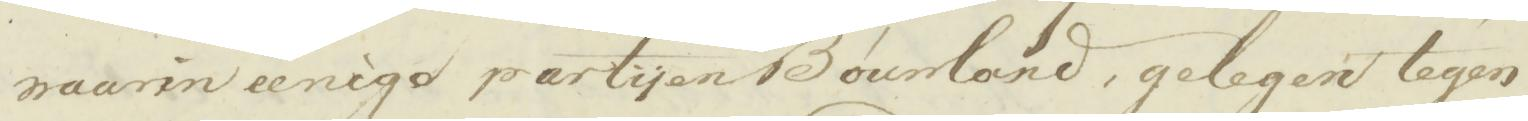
waarin eenige partijen Bouwland, gelegen tegen
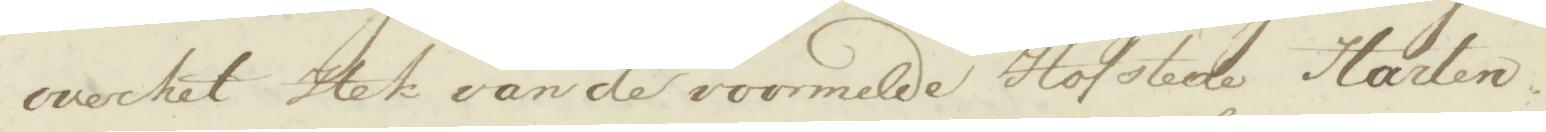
over het Hek van de voormelde Hofstede Harten„
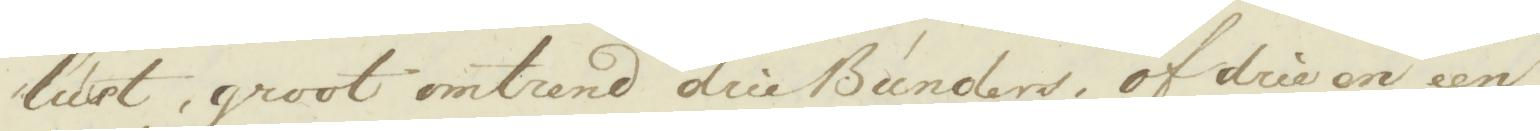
„lust, groot omtrend drie Bunders, of drie en een
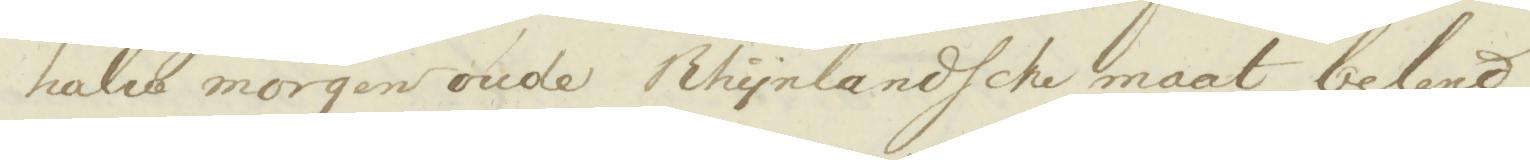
halve morgen oude Rhijnlandsche maat, belend
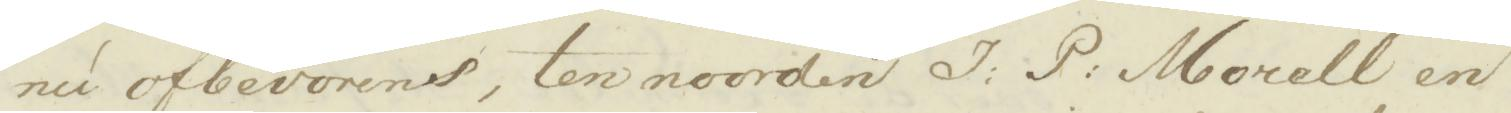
nu of bevorens, ten noorden J: P: Morell en
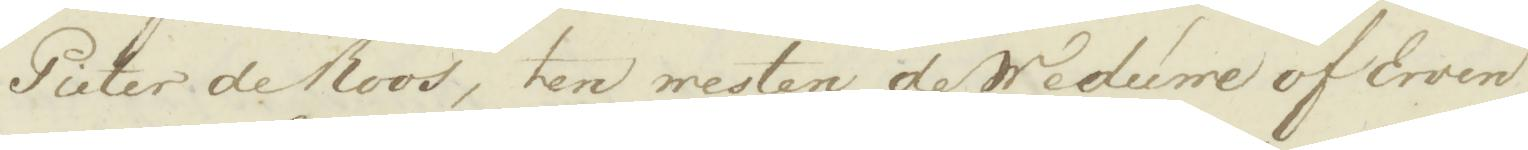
Pieter de Roos, ten westen de Weduwe of Erven
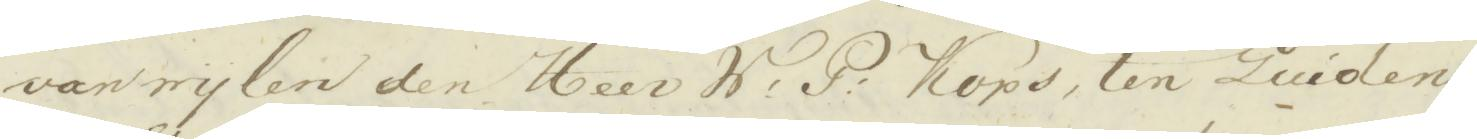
van wijlen den Heer W: P: Kops, ten zuiden
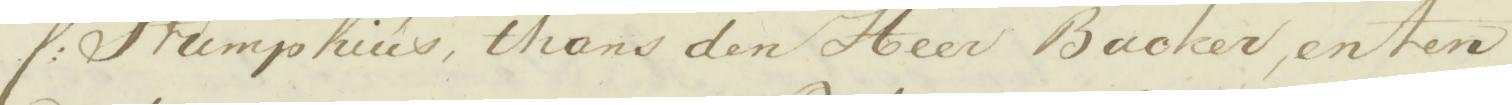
C: Stumphius, thans den Heer Backer, en ten
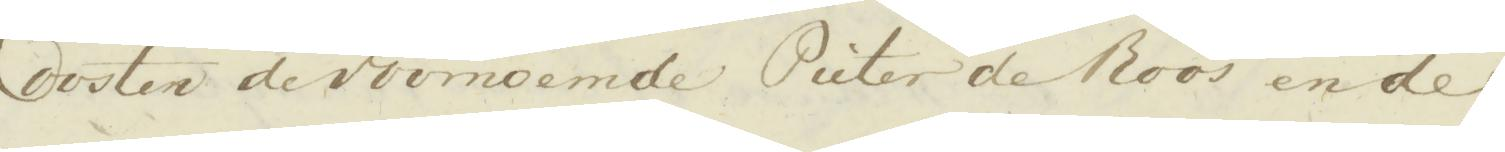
oosten de voornoemde Pieter de Roos en de
